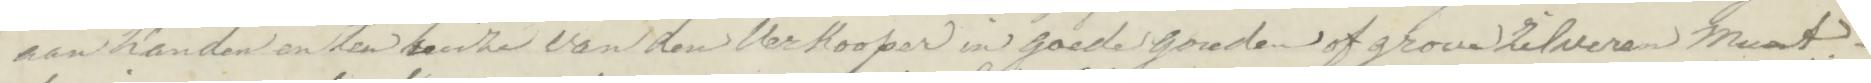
aan handen en ten huize van den Verkooper in goede gouden of grove zilveren munt-
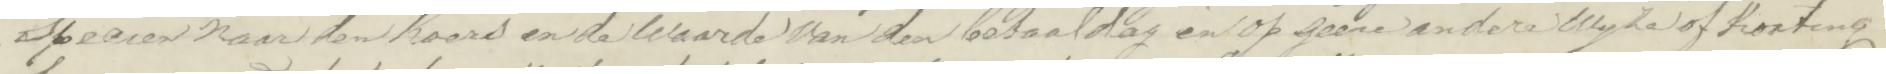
specien naar den koers en de waarde van den betaaldag en op geene andere wyze of korting
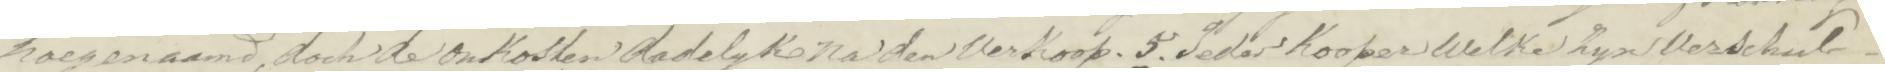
hoegenaamd, doch de onkosten dadelyk na den verkoop. 5. Ieder kooper welke zyn verschuld
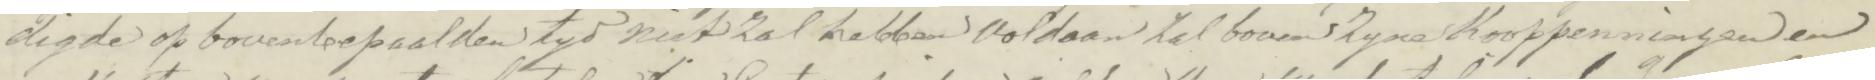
digde op bovenbepaalden tijd niet zal hebben voldaan zal boven zyne kooppenningen en
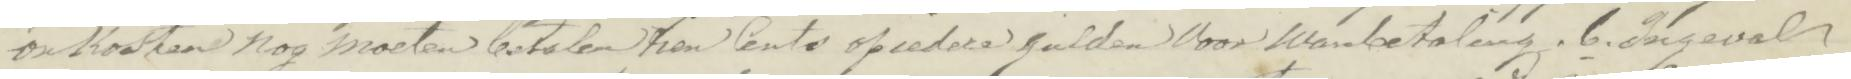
onkosten nog moeten betalen tien Cents op iedere gulden voor wanbetaling. 6. Ingeval
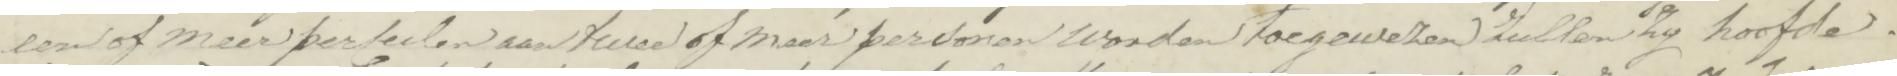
een of meer perceelen aan twee of meer personen worden toegewezen zullen zy hoofde
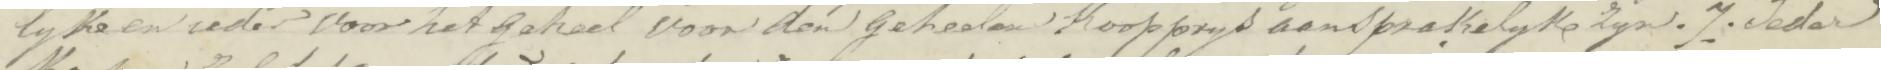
lyk en ieder voor het geheel voor den geheelen koopprys aansprakelyk zyn. 7. Ieder
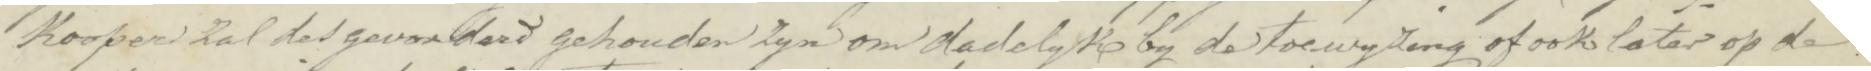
kooper zal des gevorderd gehouden zyn om dadelyk by de toewyzing of ook later op de
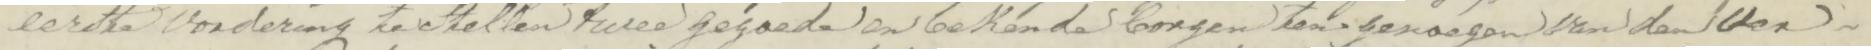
eerste vordering te stellen twee gegoede en bekende borgen ten genoegen van den Ver-
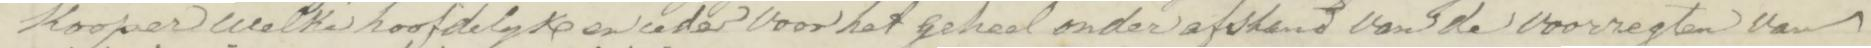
kooper welke hoofdelyk en ieder voor het geheel onder afstand van de voorregten van
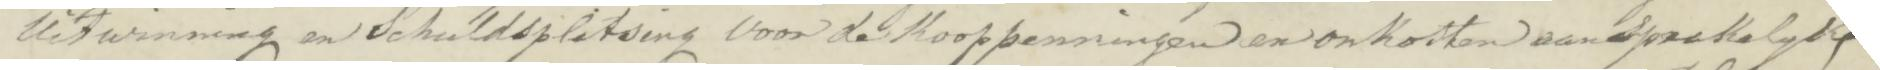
Uitwinning en Schuldsplitsing voor de kooppenningen en onkosten aansprakelyk
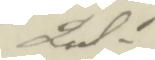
Zul-
